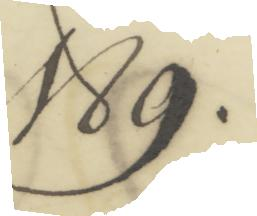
189.
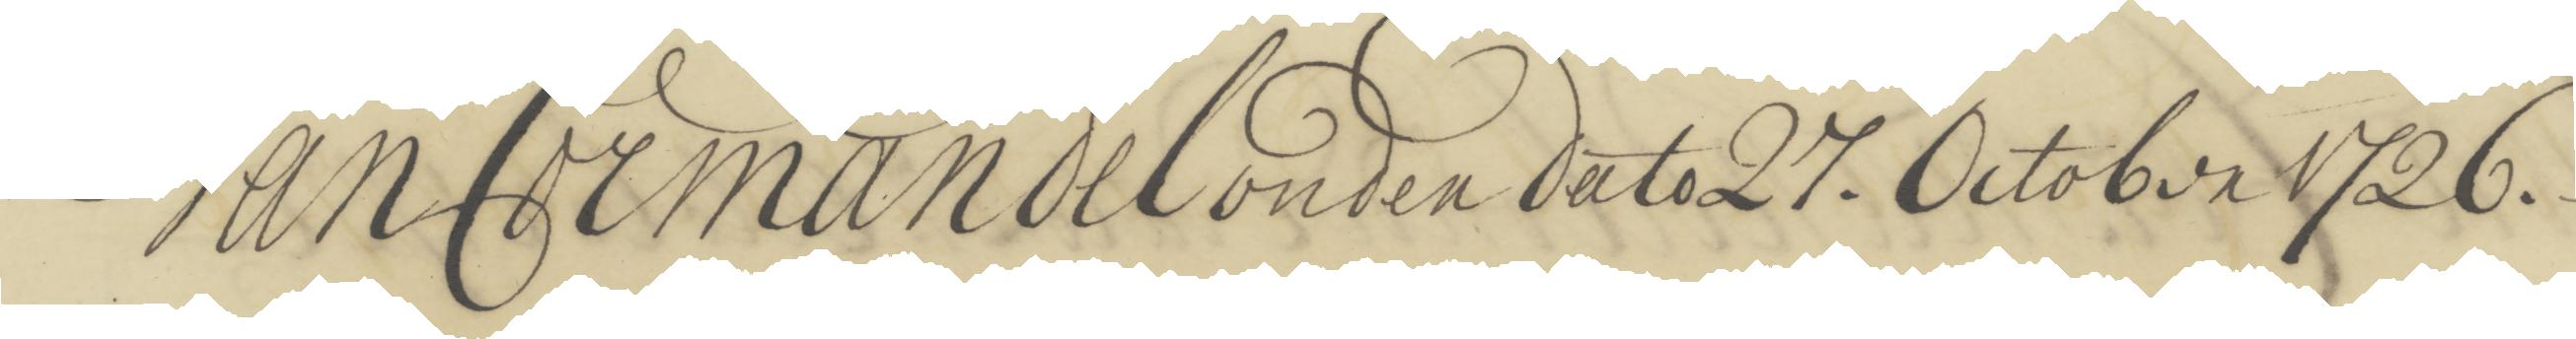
Van Cormandel onder dato 27. October 1726.
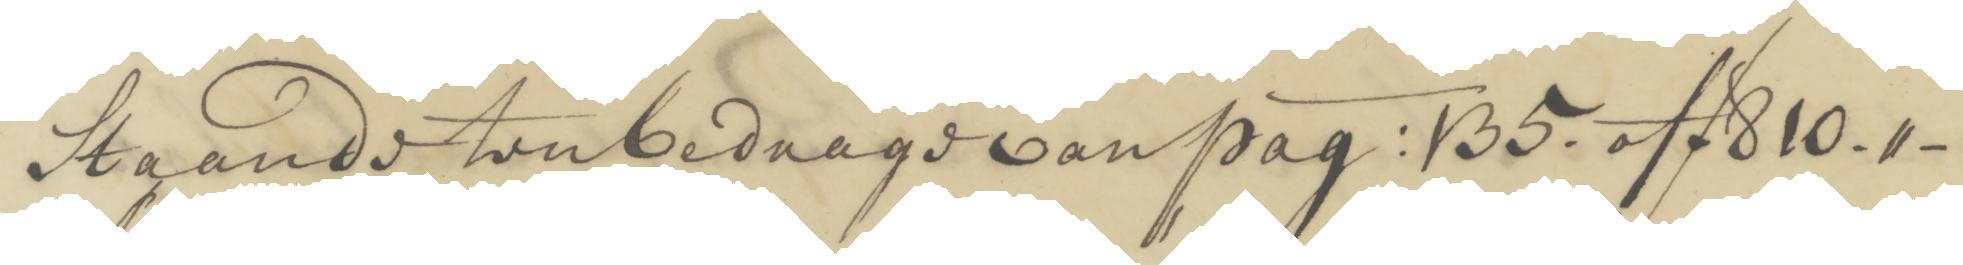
Staande ten bedrage van pag: 135. of ƒ 810-„-
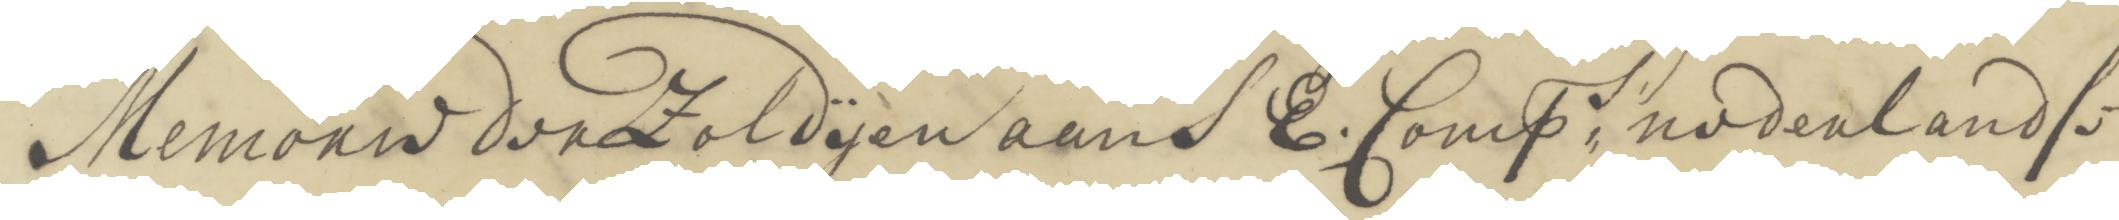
Memorie der Zoldijen aan S E. Comp„s nederlandse
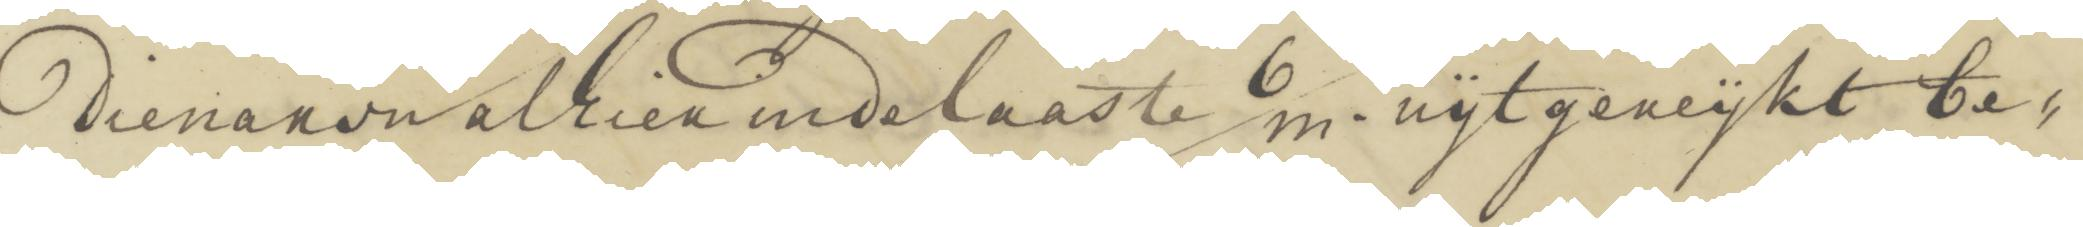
dienaren alhier inde laaste 6/m. uijtgereijkt be„
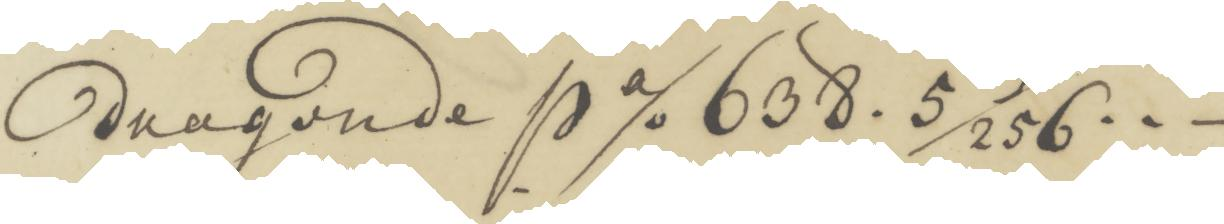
dragende p a/o 638.5 89/256..
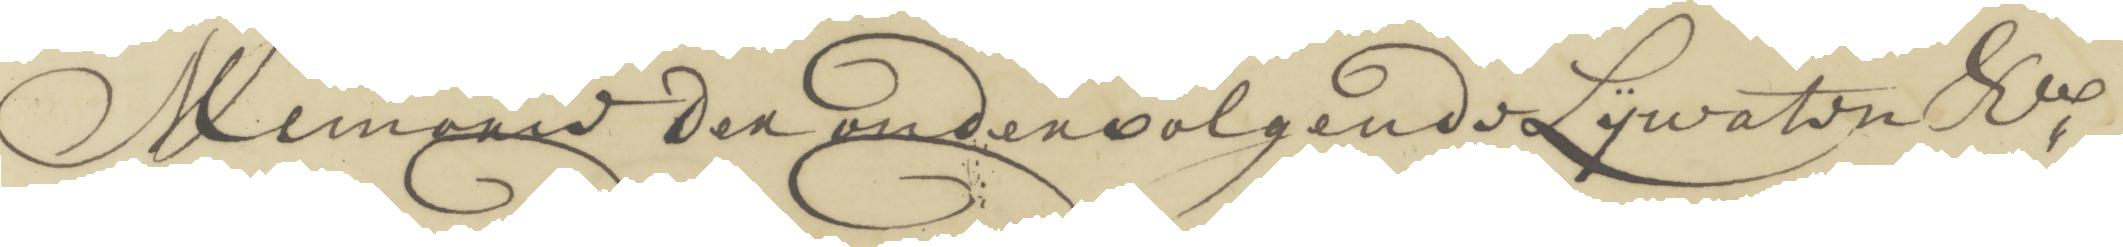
Memorie der onder volgende Lijwaten &„a
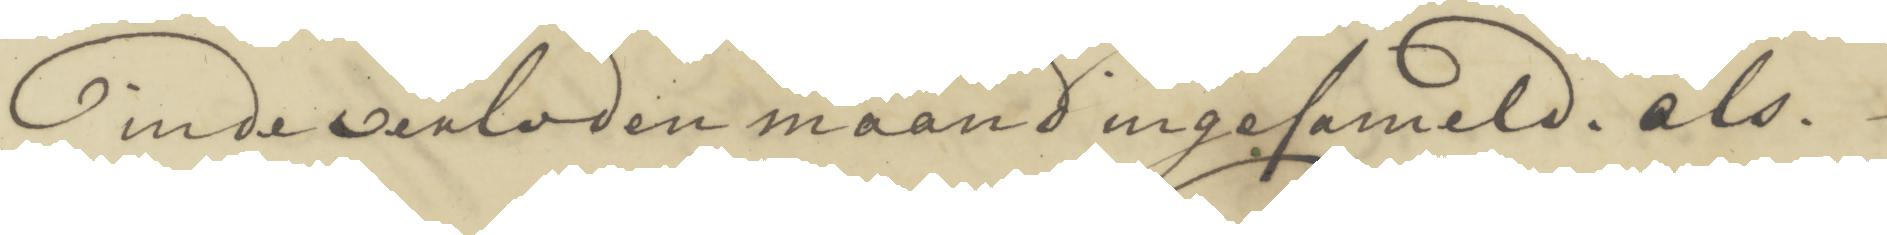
in de verleden maand ingesameld. als.
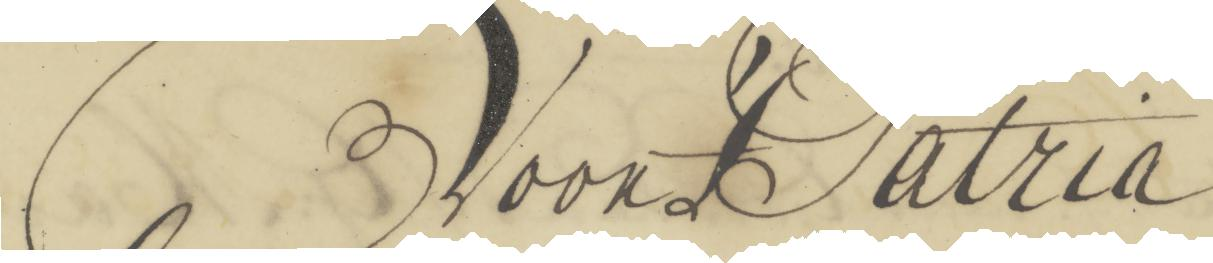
Voor 't Patria
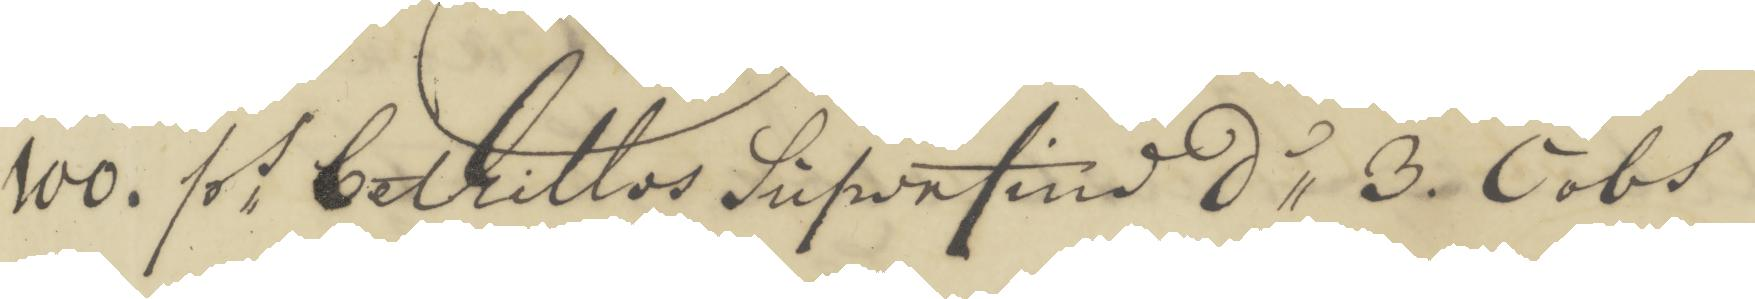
100. p„s bethilles superfine d„' 3. Cobs
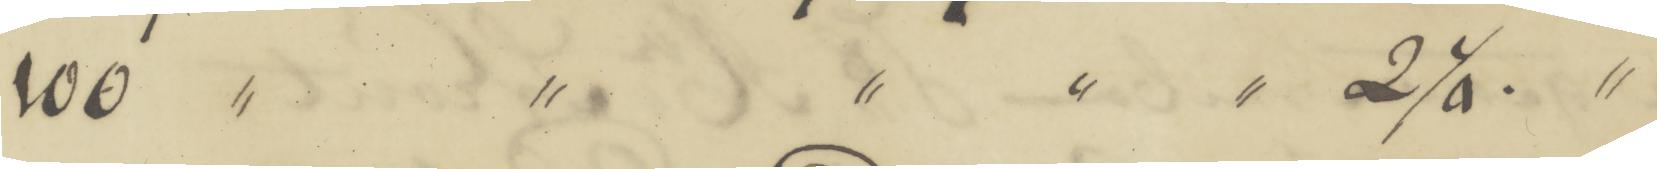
100 „ „ „ „ „ 2¼. „
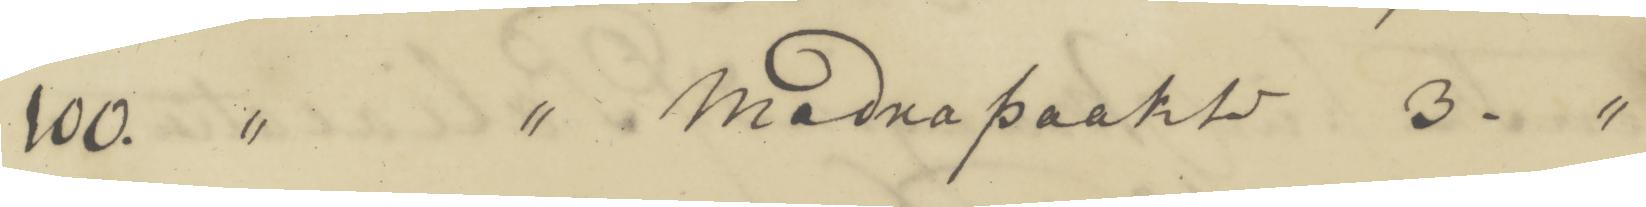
100. „ „ madrapaakse 3. „
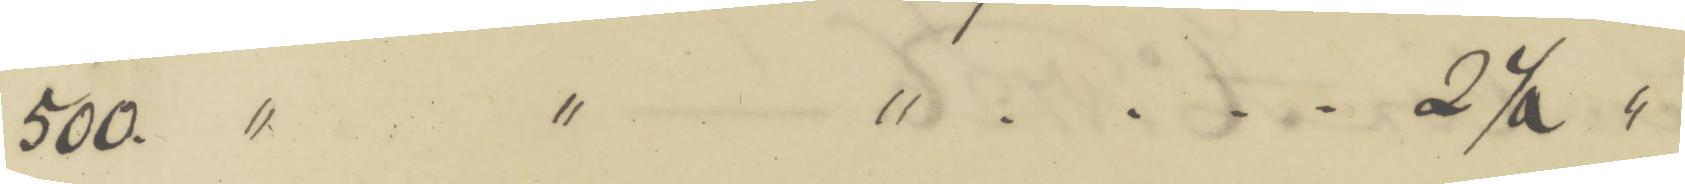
500. „ „ „ 2¼ „
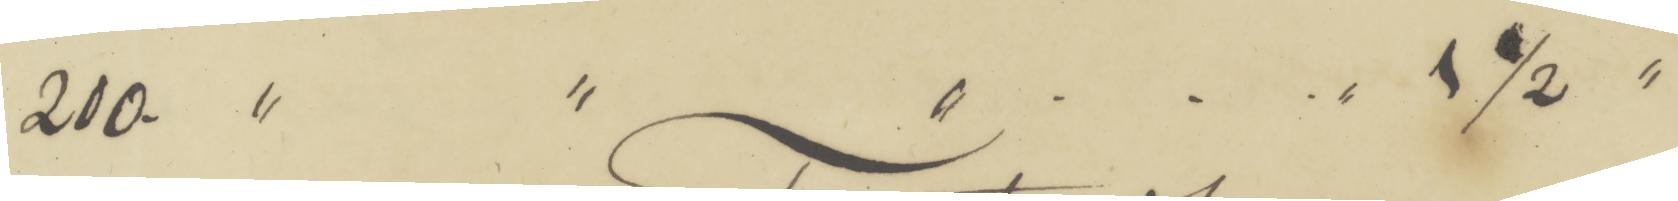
200. „ „ „ 1½ „
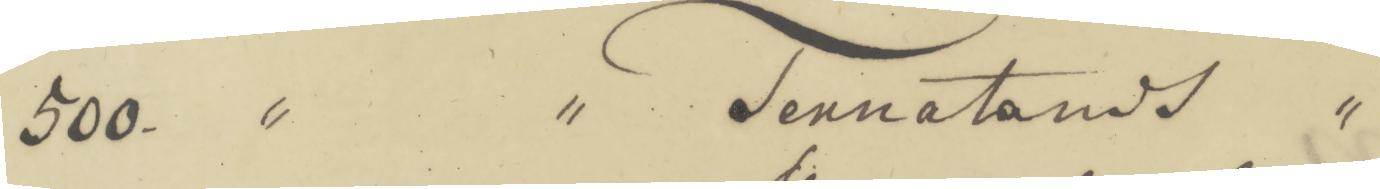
500. „ „ Ternatanes „
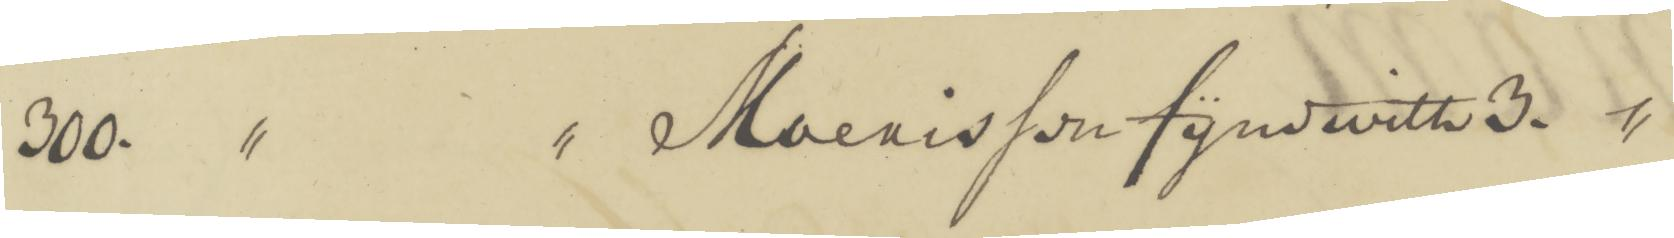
300. „ „ Moerissen fijne witte 3. „
